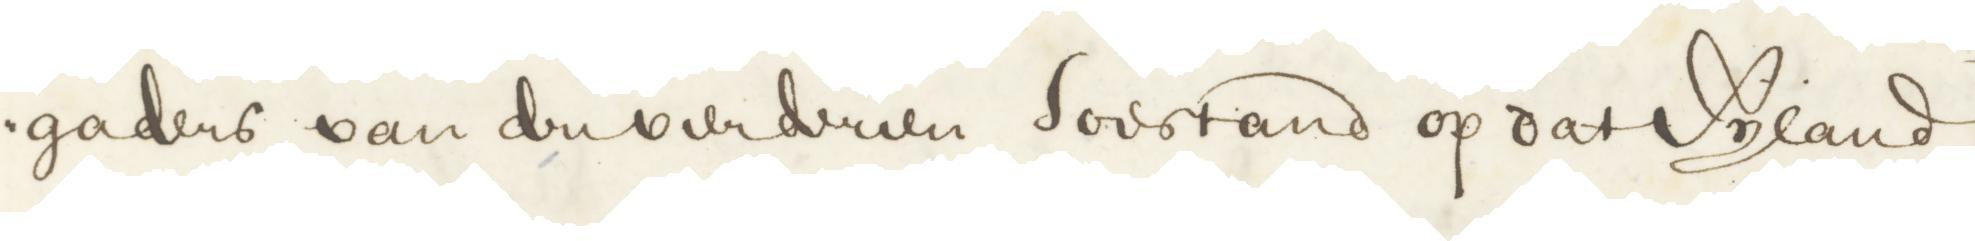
„gaders van den verderen toestand op dat Eijland,
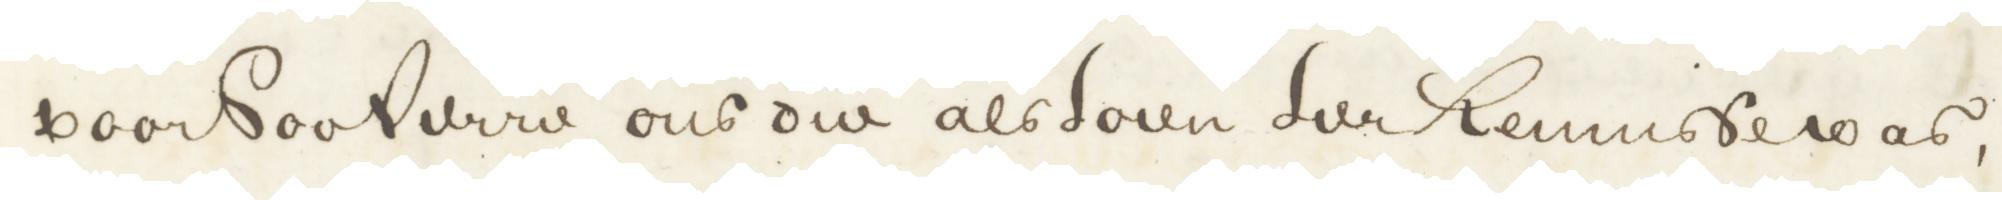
voor sooverre ons die als toen ter kennisse was,
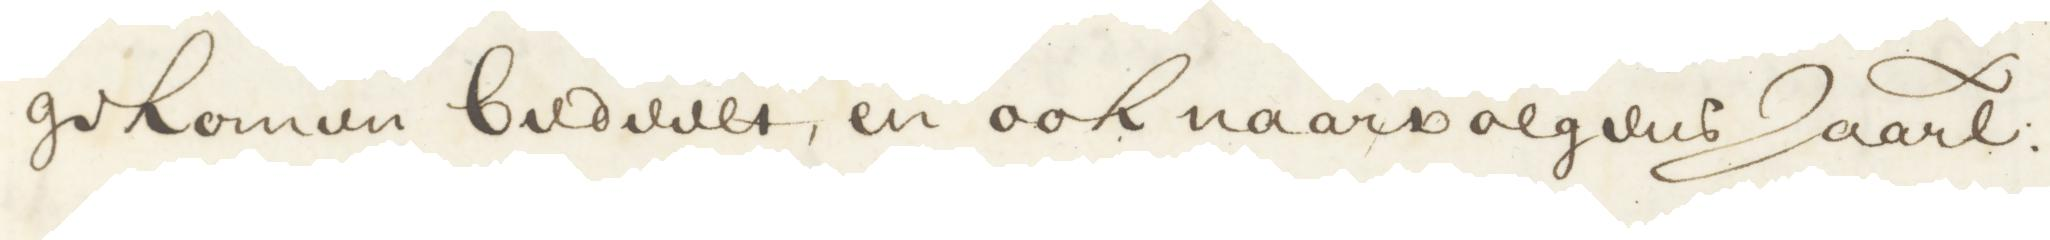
gekomen bedeelt, en ook naarvolgens Jaarl:
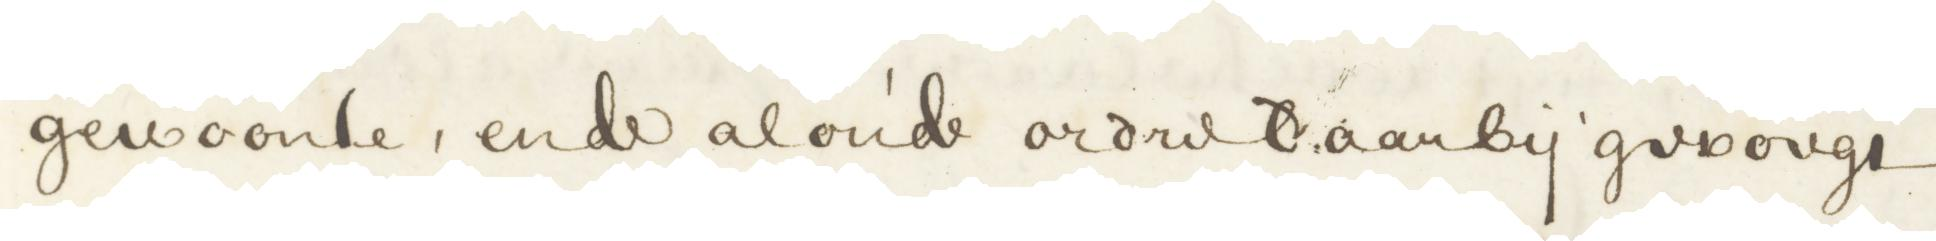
gewoonte, ende aloude ordre daar bij gevoegt
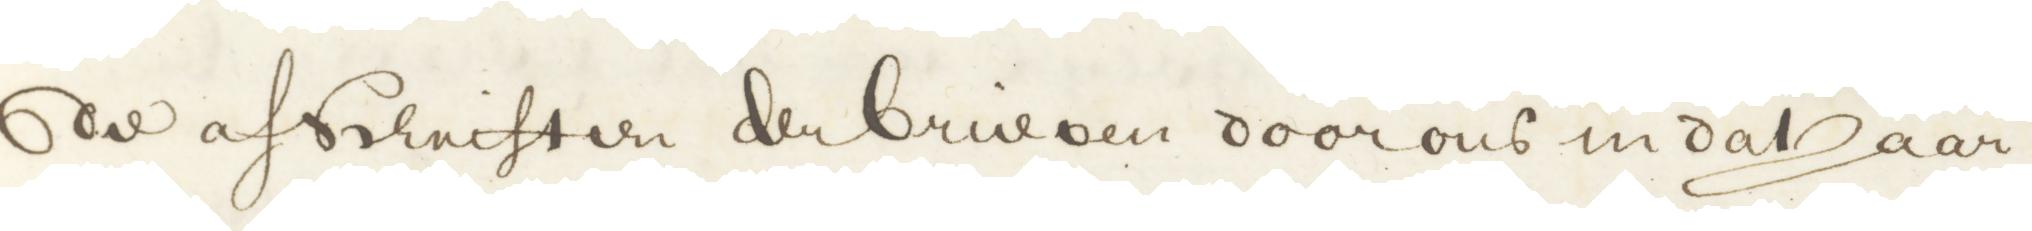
de afschriften der brieven door ons in dat jaar
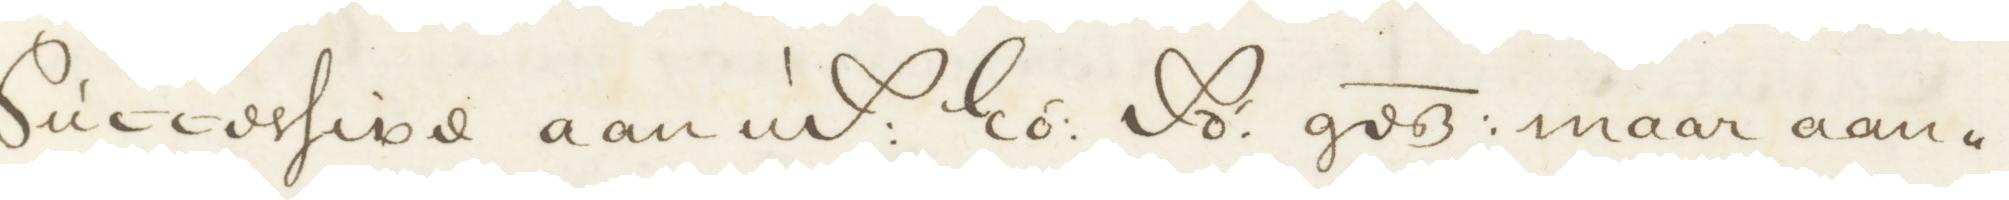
Successive aan uE: ho: Ed: gesz: maar aan„
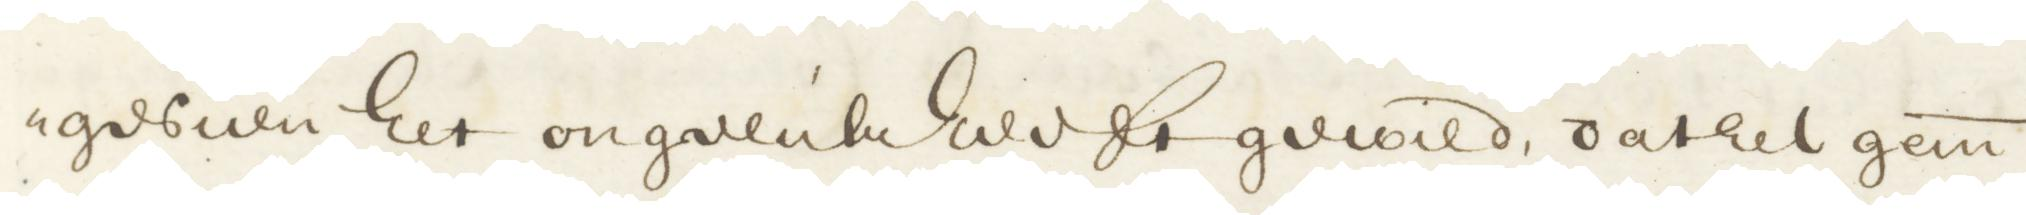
„gesien het ongeluk heeft gewild, dat het gem
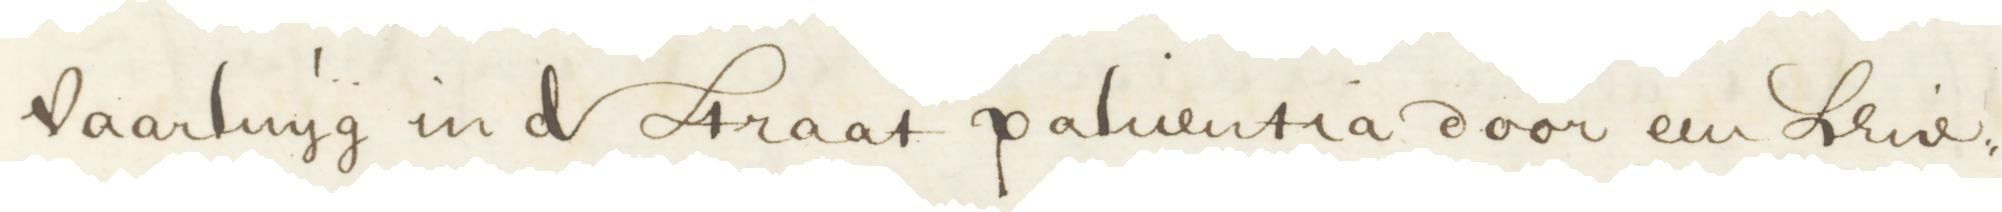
vaartuijg in de straat patientia door een schie
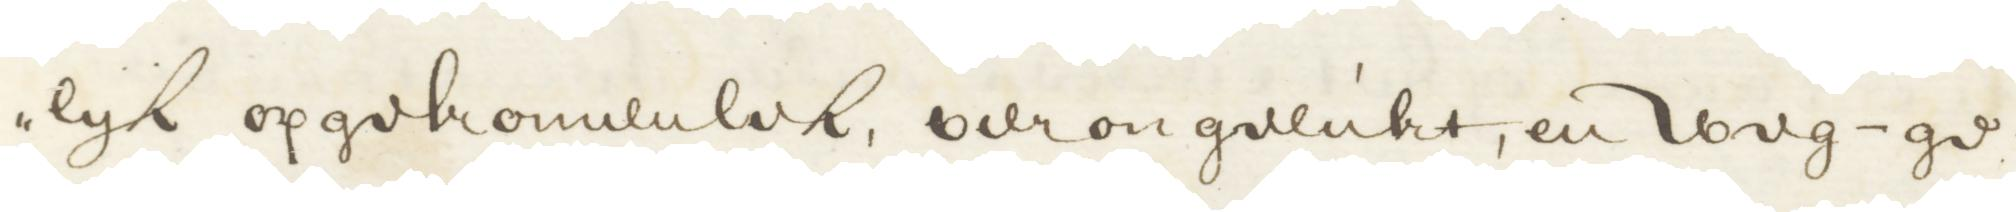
„lijk op gekomen lek, verongelukt, en weg-ge
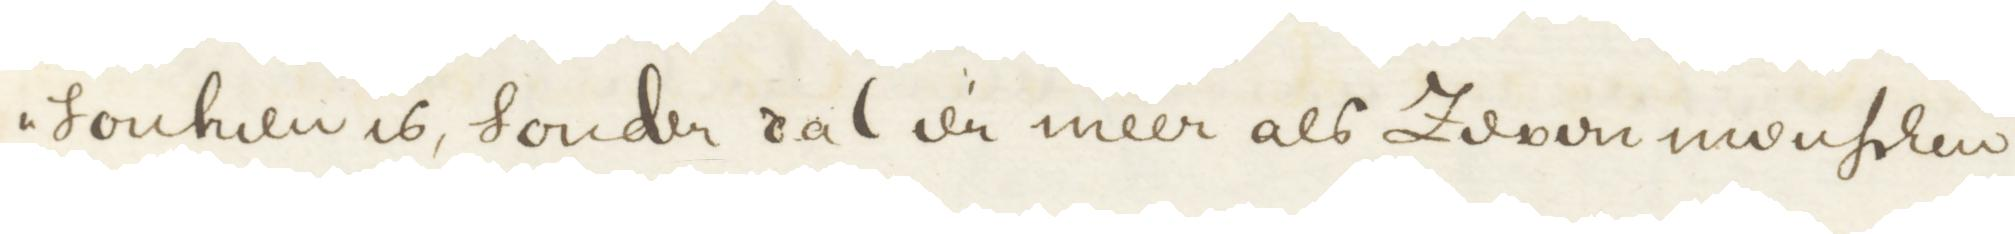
„sonken is, sonder dat 'er meer als zeven menschen
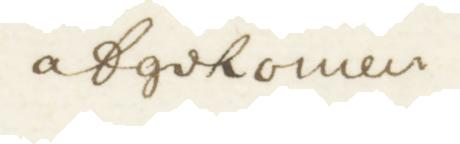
afgekomen
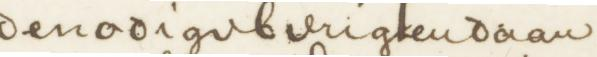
de nodige berigten daar
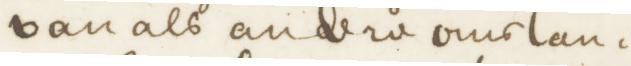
van als andere omstan„
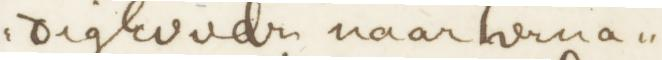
„digheeden naar terna„
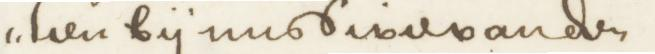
„ten bij missive van den
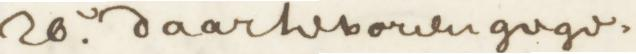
20.' daartevoren gege„
